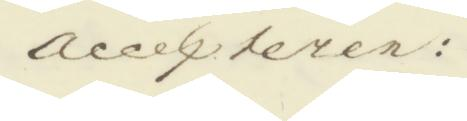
aecelteren:
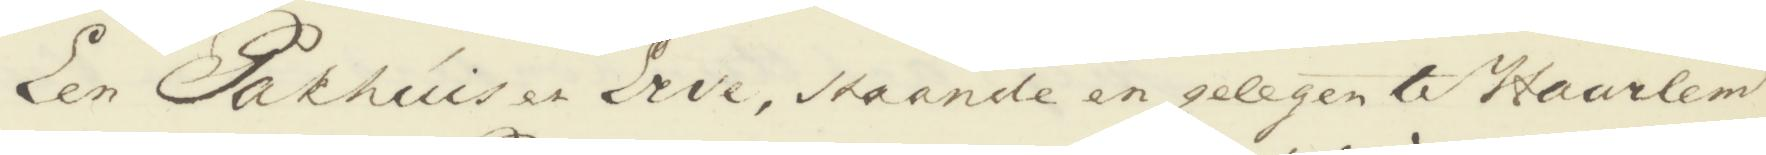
Een Pakhuis en Erve, staande en gelegen te Haarlem
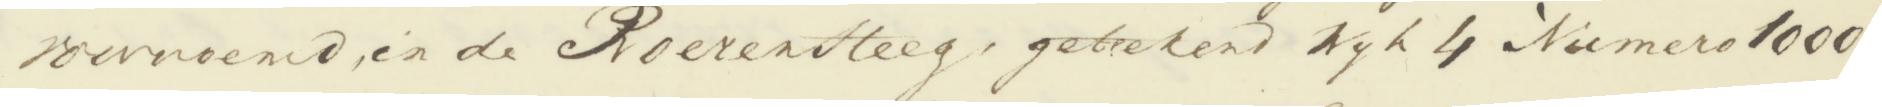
voornoemd, in de Boerensteeg, getekend Wyk 4 Numero 1000.
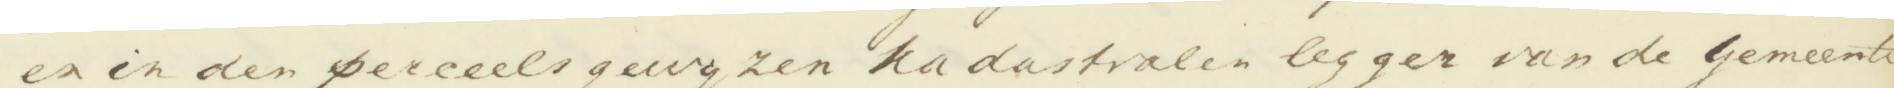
en in den perceels gewyzen kadastralen legger van de Gemeente
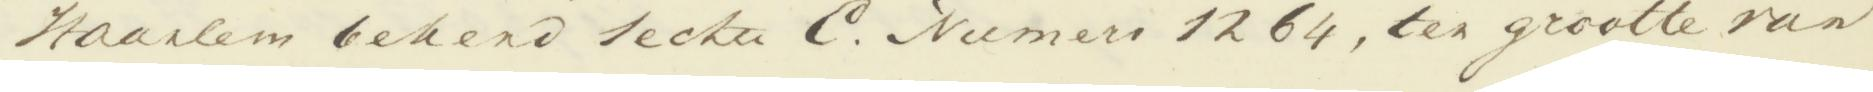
Haarlem bekend sectie C. Numero 1264, ter grootte van
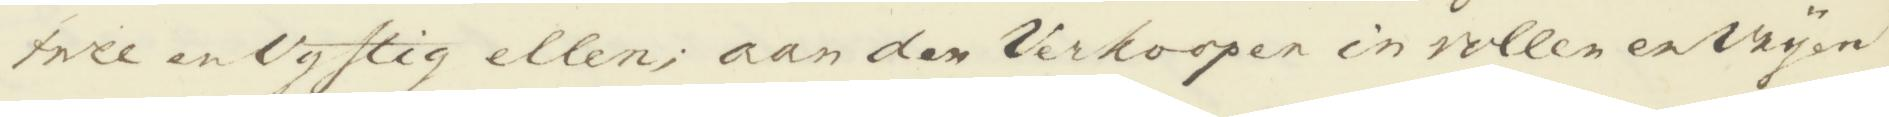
twee en vyftig ellen; aan den Verkooper in vollen envrijen
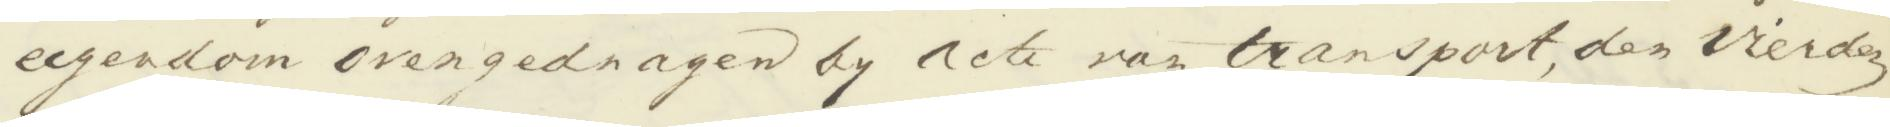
eigendom overgedragen by Acte van transport, den vierden
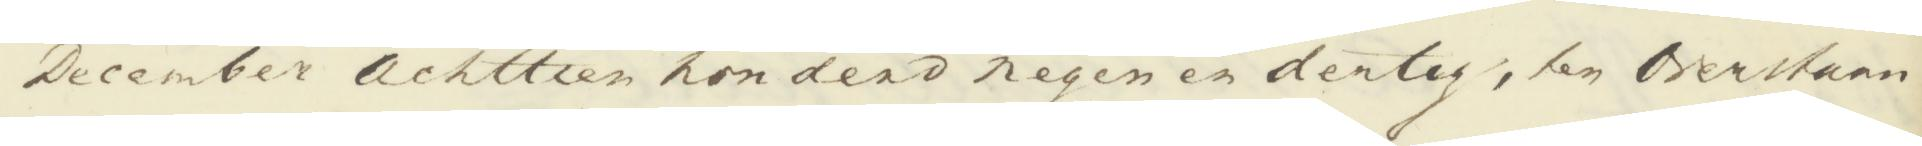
December achttien honderd negen en dertig, ten overstaan
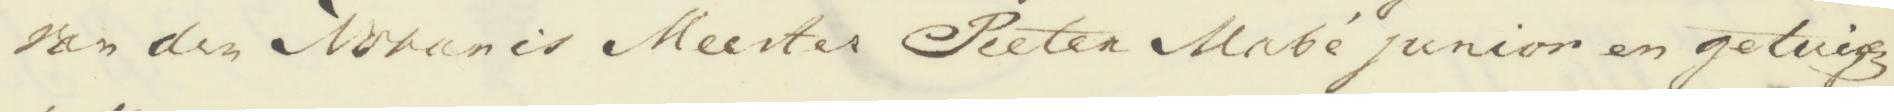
van den Notaris Meester Pieter Mabé junior en getuigen
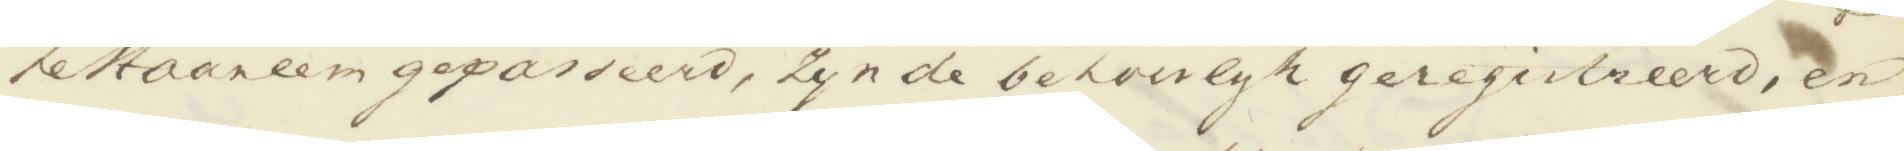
te Haarlem gepasseerd, zyn de behoorlyk geregistreerd, en
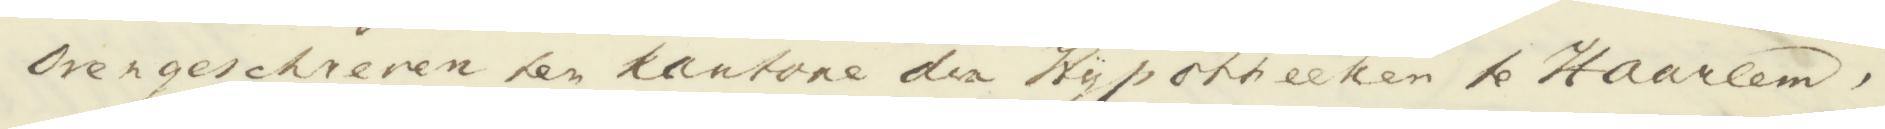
overgeschreven ten kantore der Hijpotheeken te Haarlem,
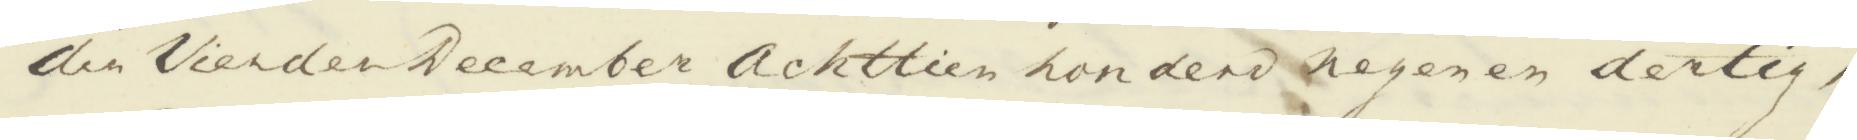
den Vierden December Achttien honderd negen en dertig,
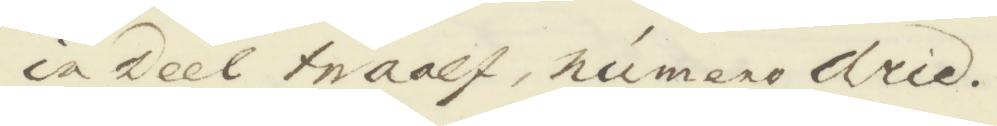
in Deel twaalf, numero drie.
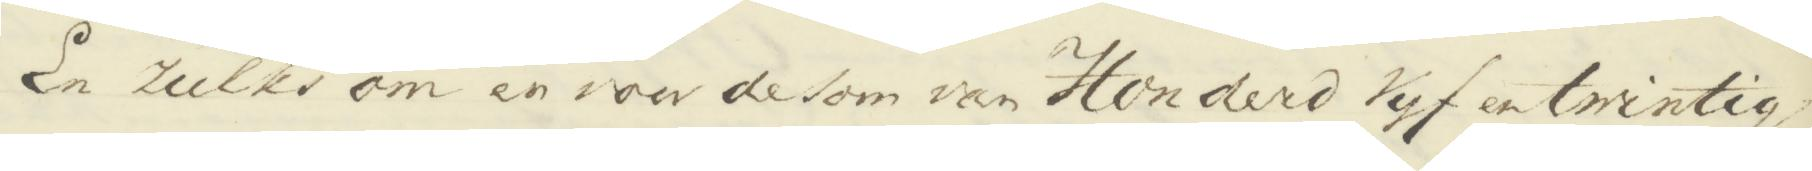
En zulks om en voor de som van Honderd Vyf en twintig
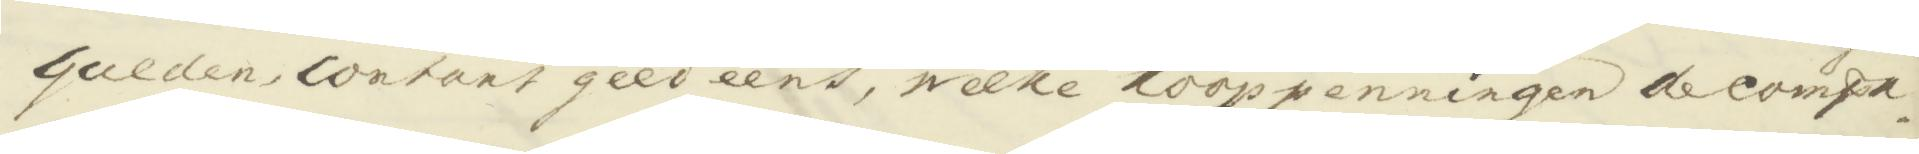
Gulden, contant geld eens, welke kooppenningen de compa
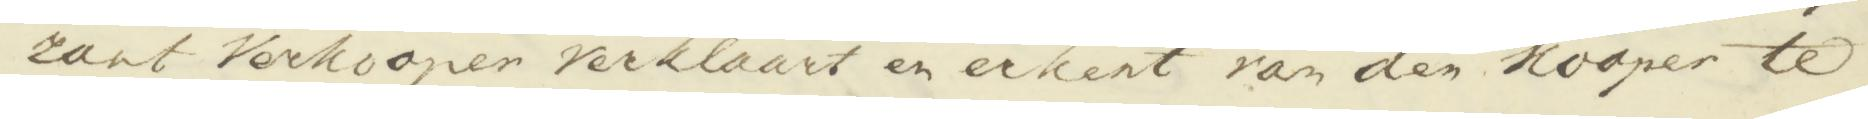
rant verkooper verklaart en erkent van den kooper te
